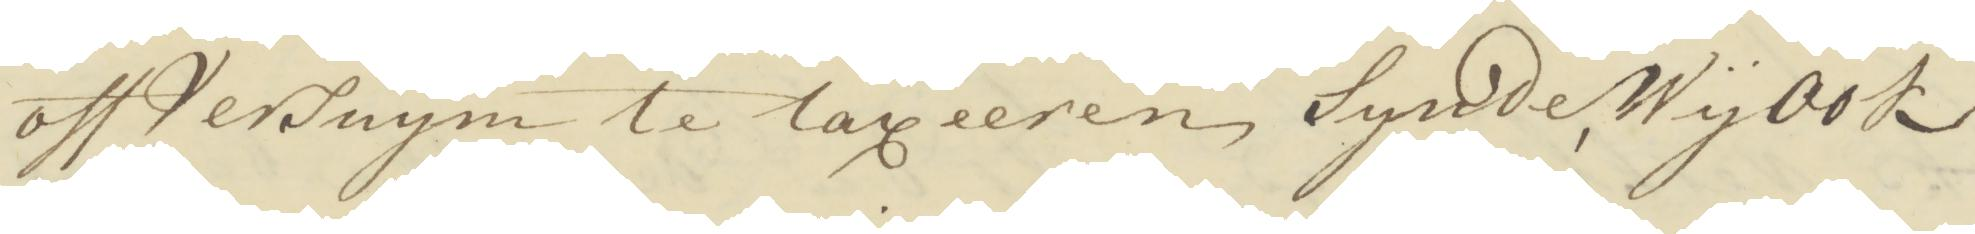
off versuijm te taxeeren Synde Wij Ook
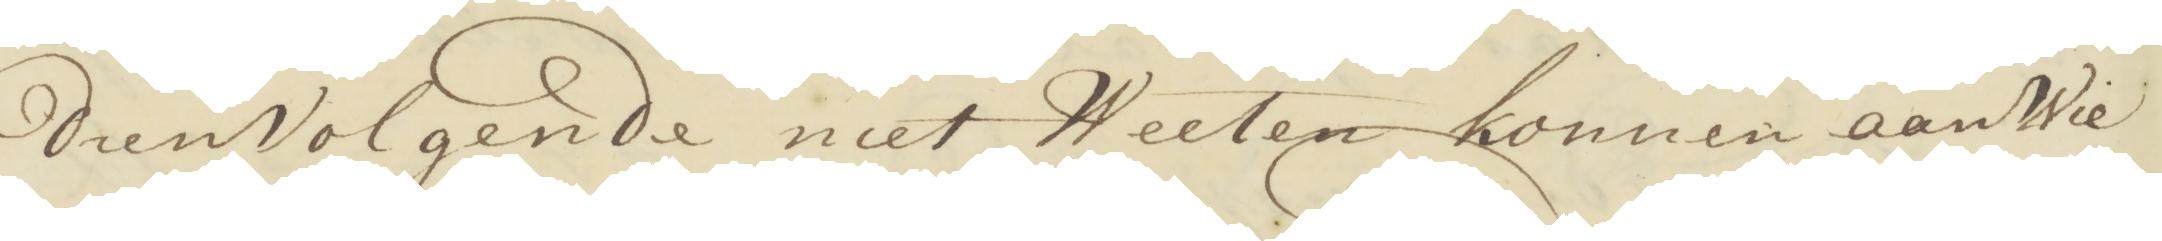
dien Volgende niet Weeten konnen aan Wie
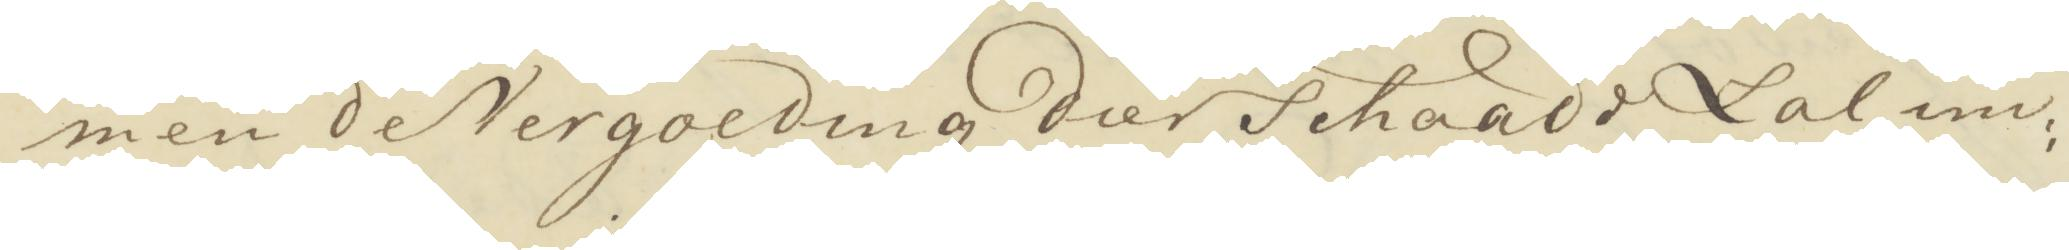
men de Vergoeding dier Schaade Zal im„
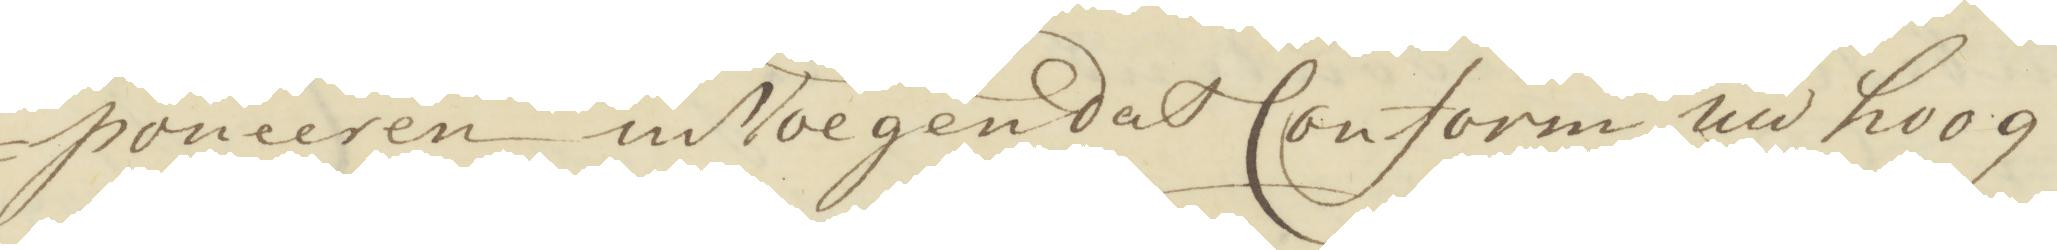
=poneeren in Voegen dat Conform uw hoog
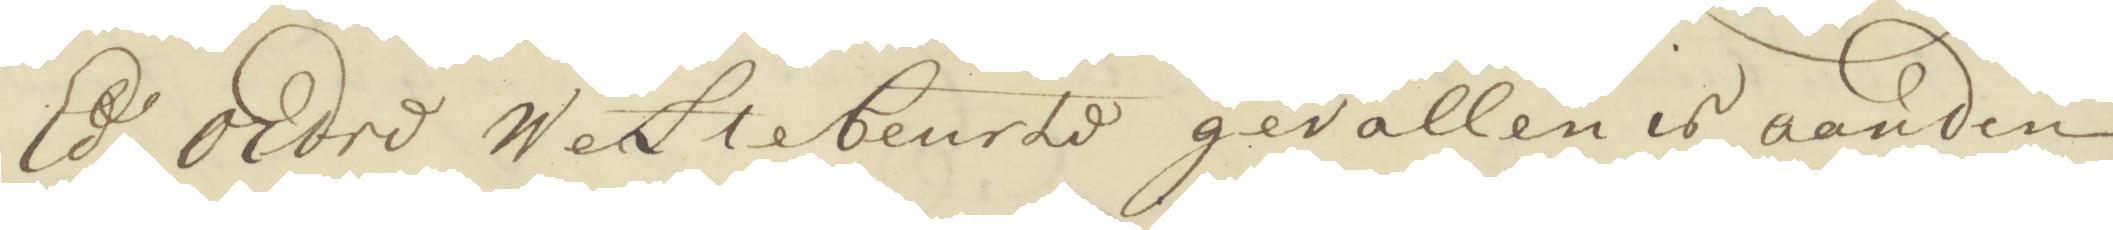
Ed:' ordre wel te beurte gevallen is aan den
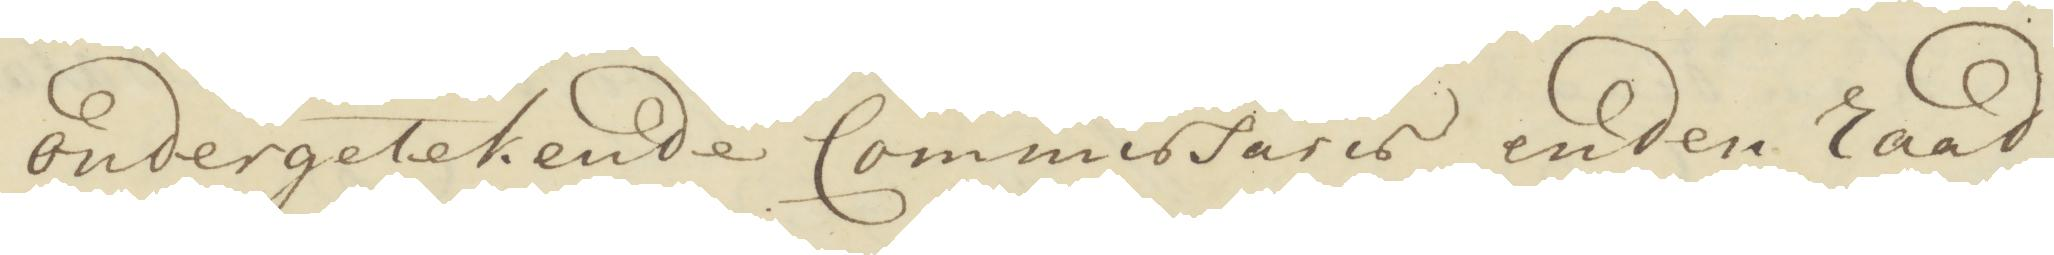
ondergetekende Commissaris en den Raad
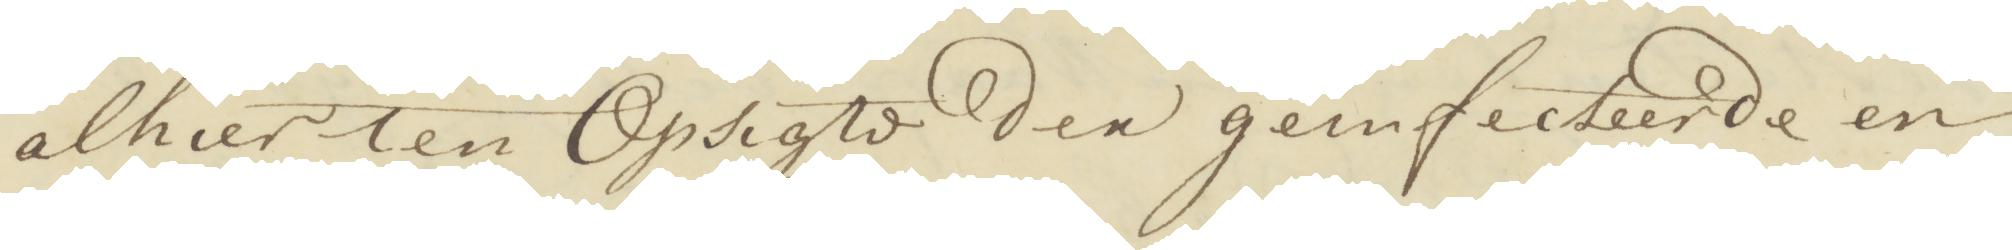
alhier ten Opsigte der geinfecteerde en
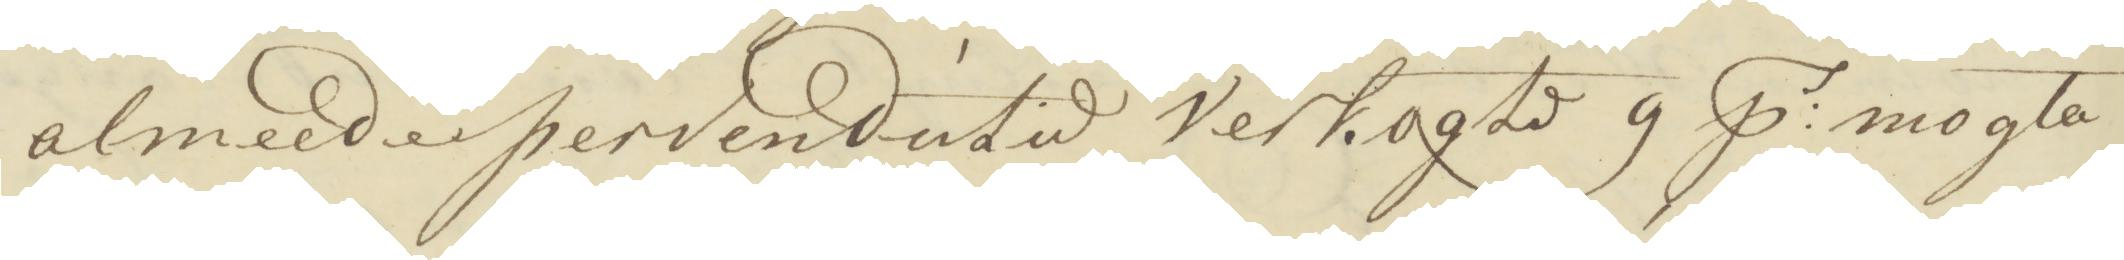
almeede per vendutie verkogte 9 p:s mogta
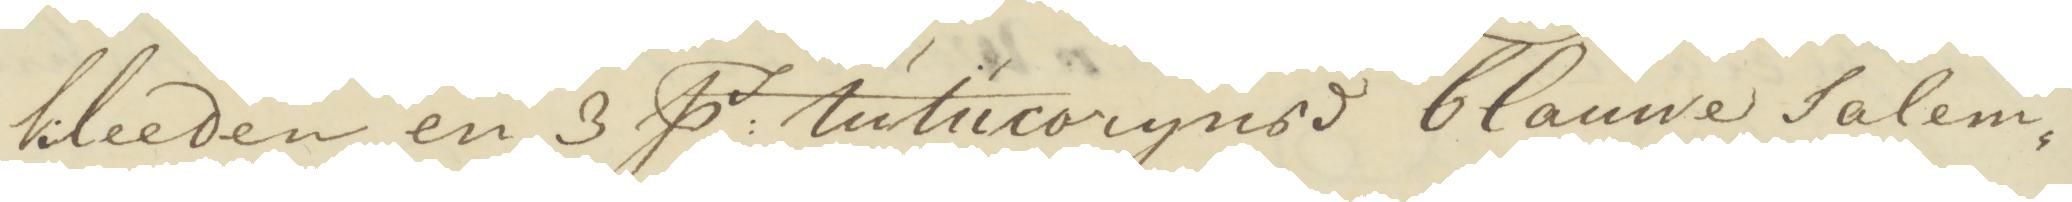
kleeden en 3 p:s tutucorijnse blauwe salem„
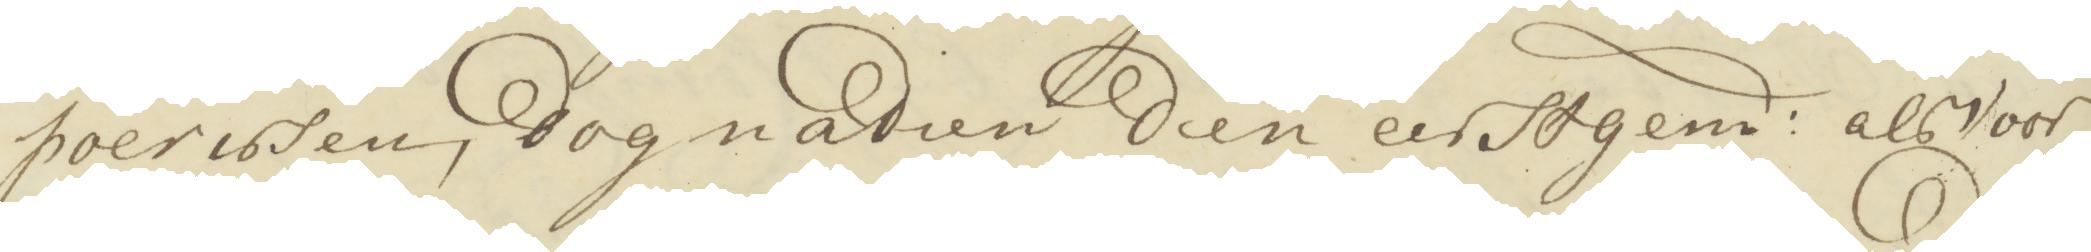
poerissen, dog nadien dien eerstgem: als voor
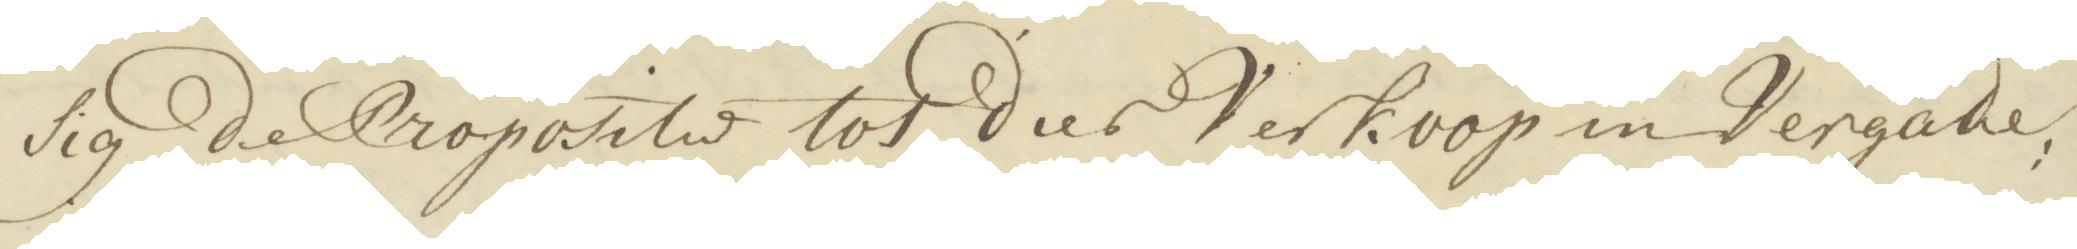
sig de Propositie tot dies Verkoop in Vergade:
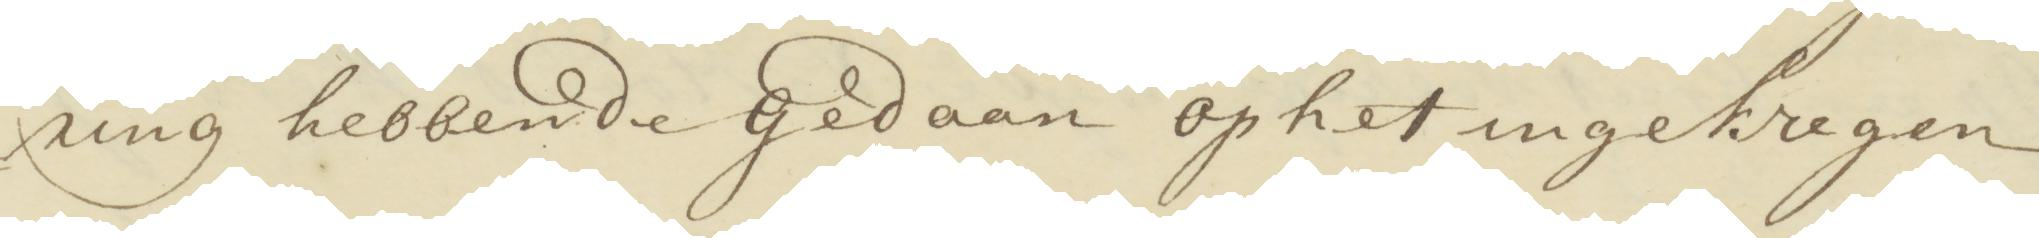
„ring hebbende gedaan op het ingekregen
